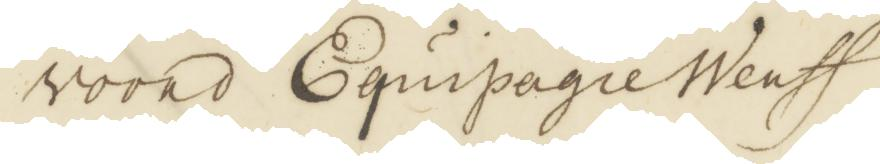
voord' Equipagie Werff
